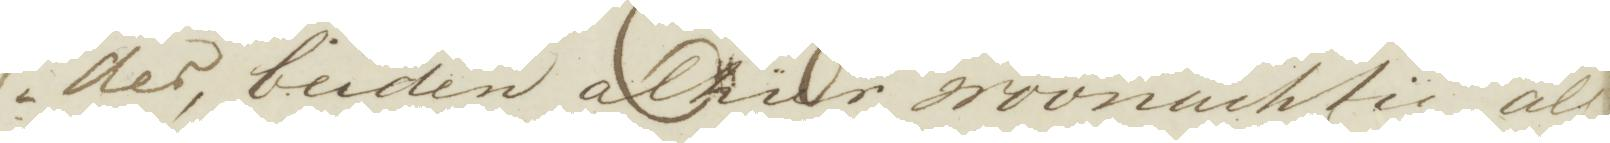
=der, beiden alhier woonachtig, als
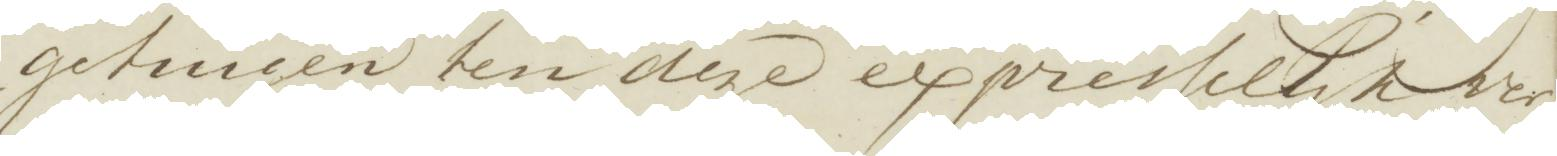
getuigen ten deze expresselyk ver
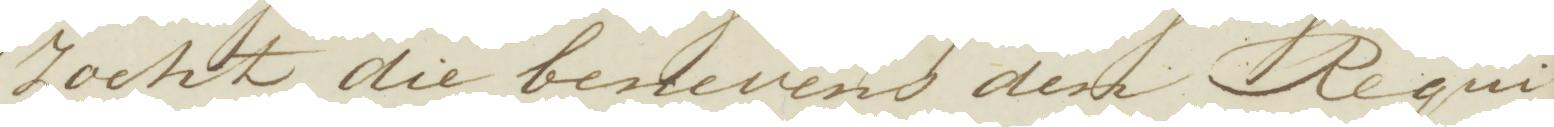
zocht, die benevens den Requi:
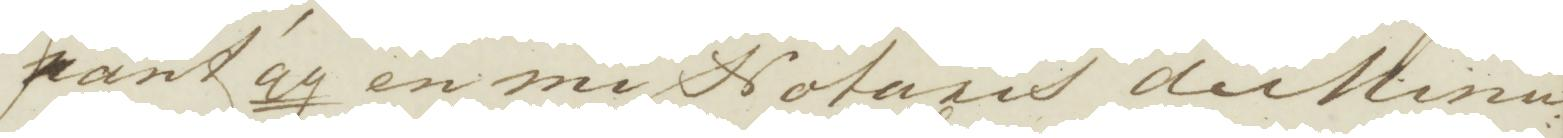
rant qq en my Notaris de Minu:
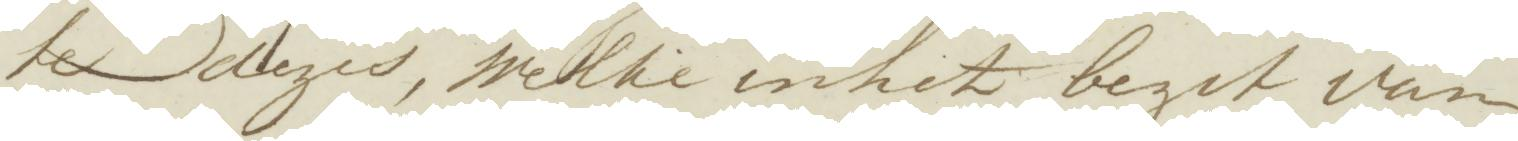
te dezes, welke in het bezit van
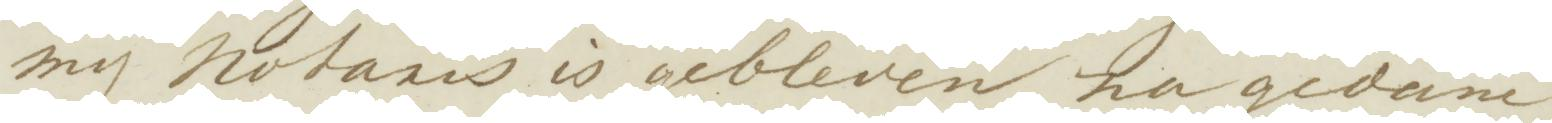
my notaris is gebleven, na gedane
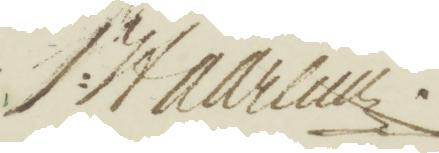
J: Haarlem.
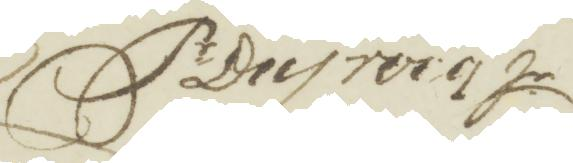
P=r Du Crocq J.r
